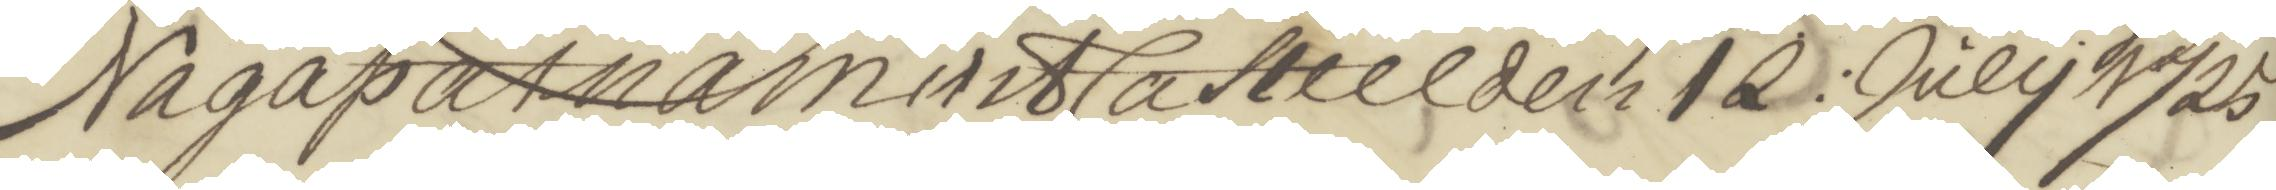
Nagapatnam int Casteel den 12: Julij 1725
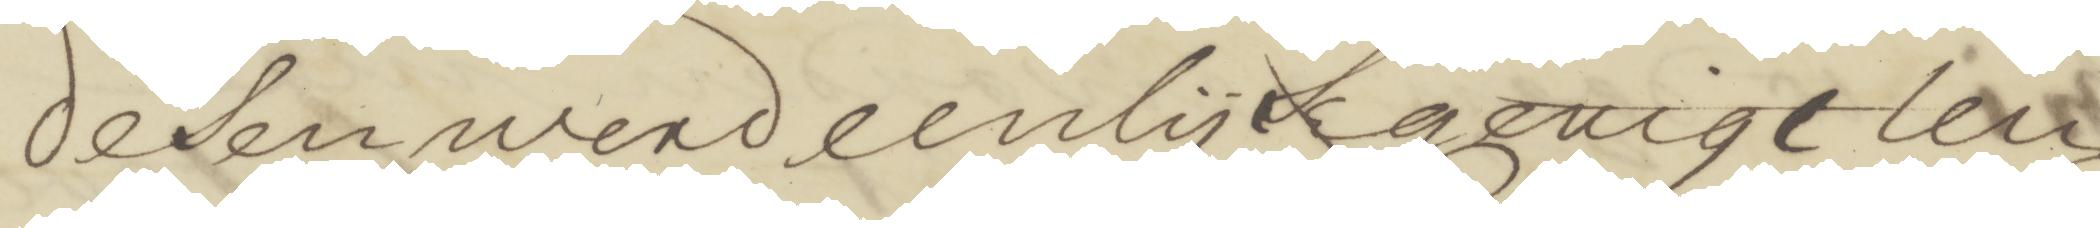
desen werd eenlijk gerigt ten
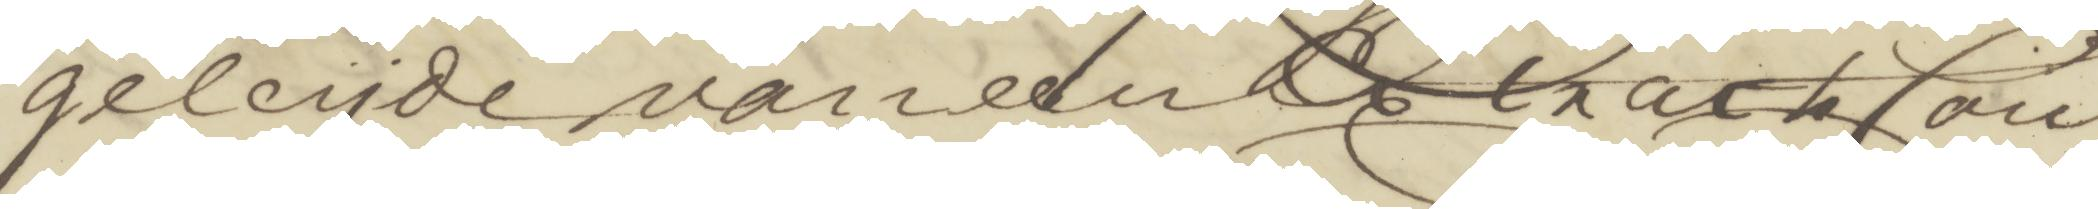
geleijde van een Extract Cou,
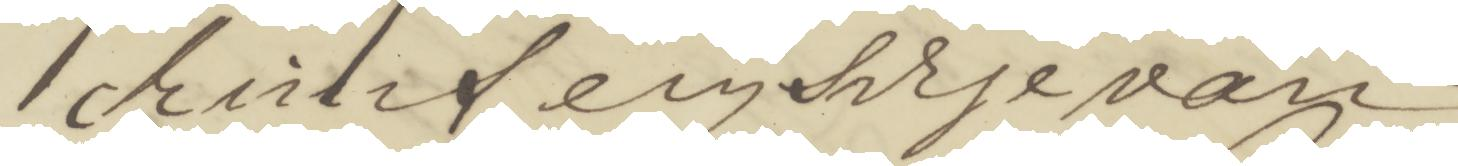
chinse eijschje van
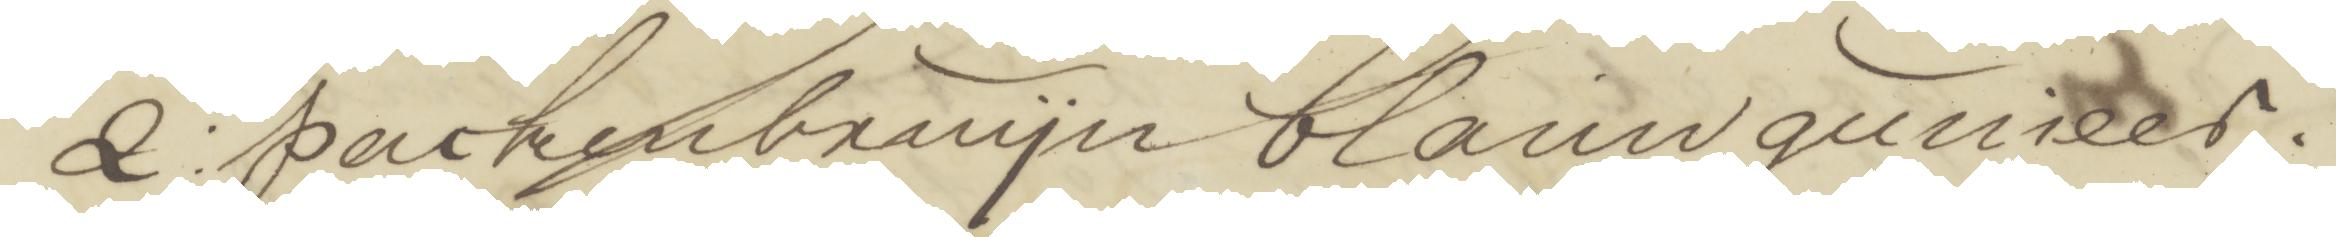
2: packen bruijn blauw guniees.
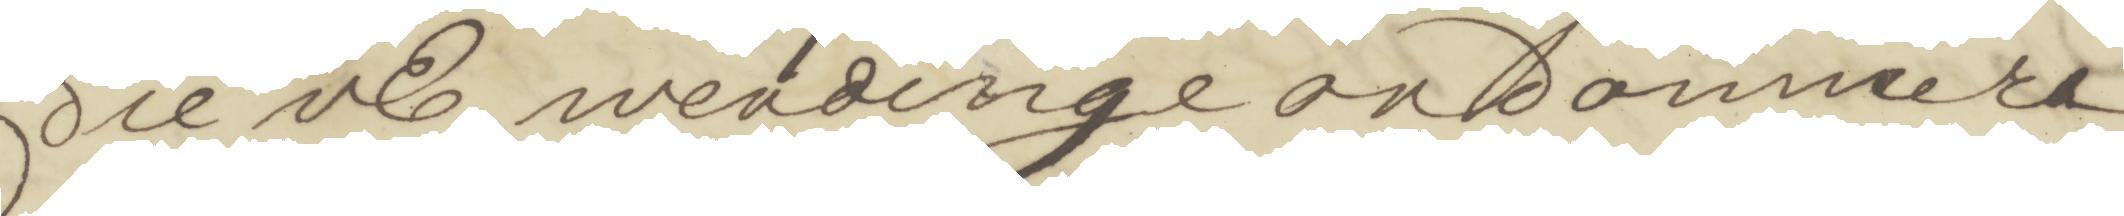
die vE werdinge ordonneert
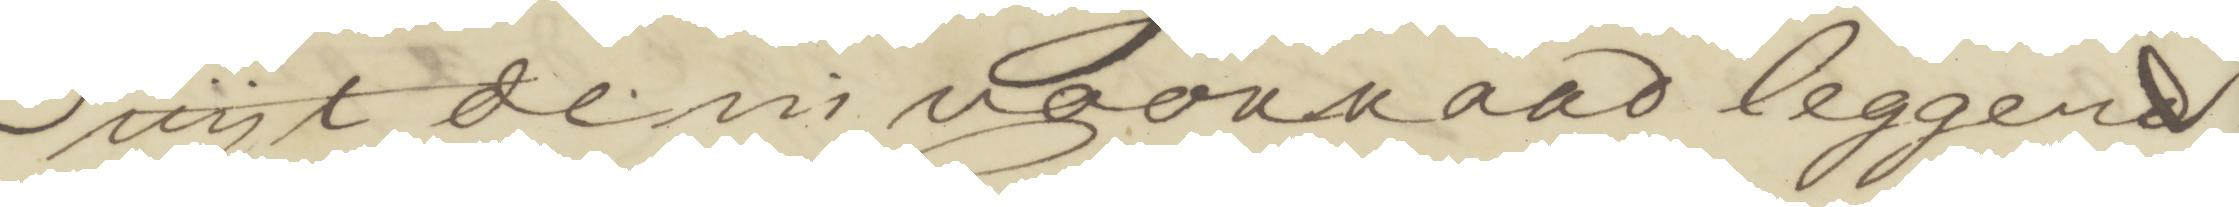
uijt de in voorraad leggend
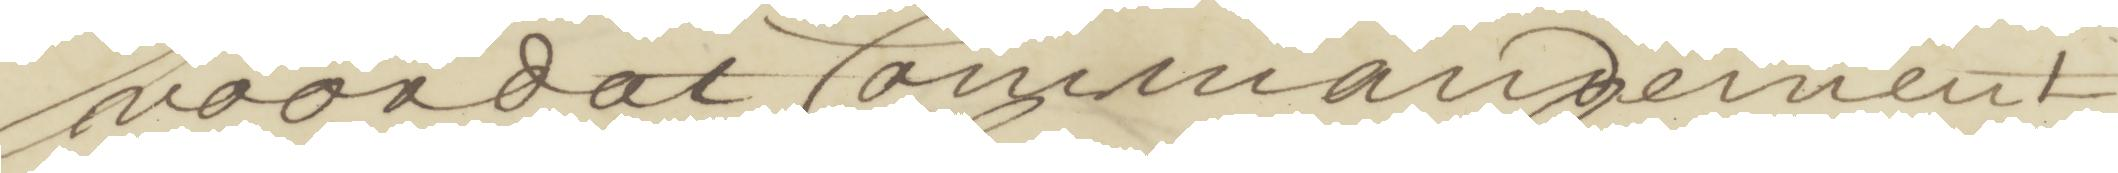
voor dat Commandement
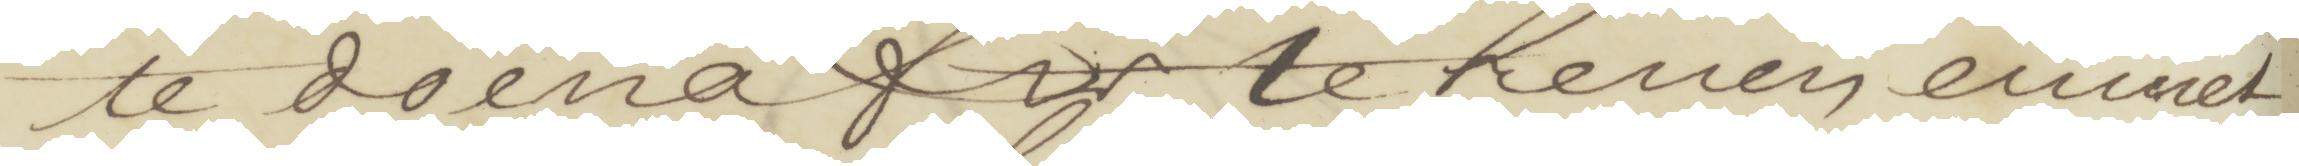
te doen af te te kenen en met
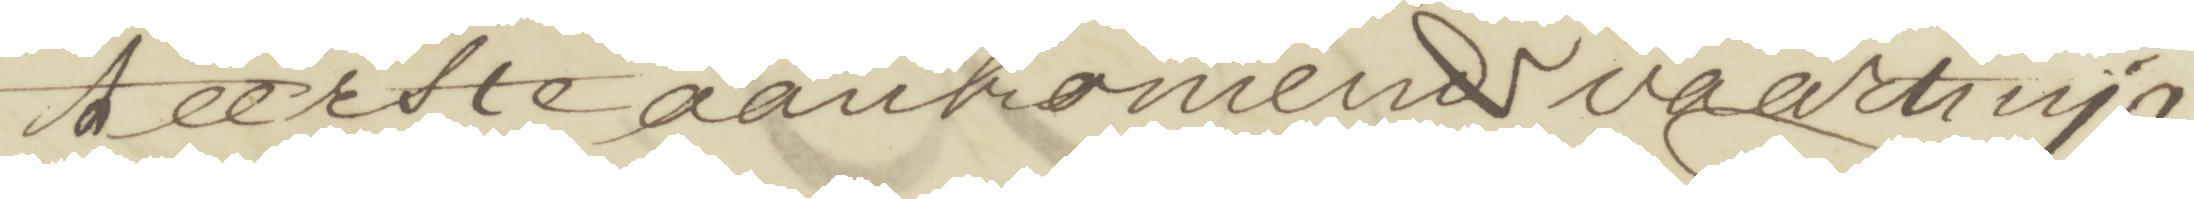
t eerste aankomende vaartuijg
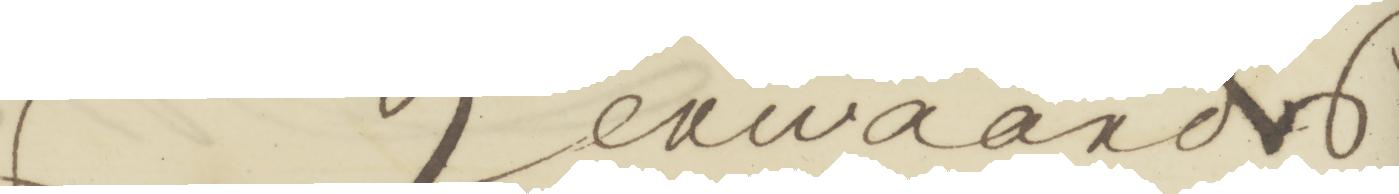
Herwaards
